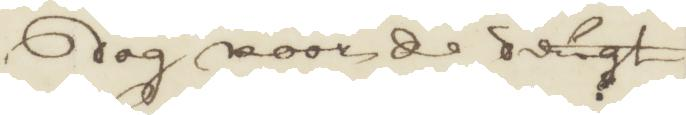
dog voor de deugt
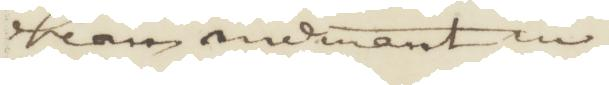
kan niemant in
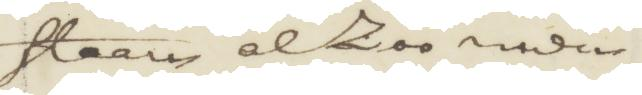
staan alzoo men
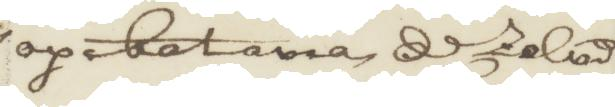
„op batavia de zelve
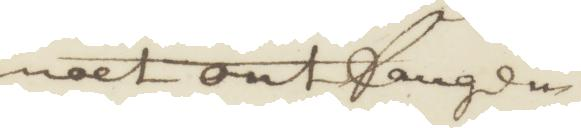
moet ontfangen
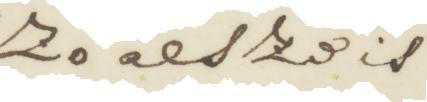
zo als ze is
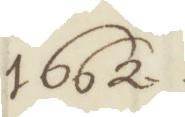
1662-
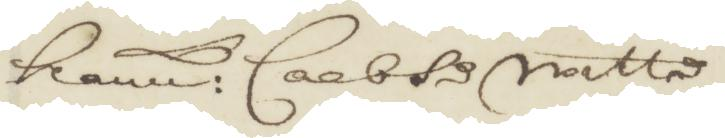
kann: Caabse witte
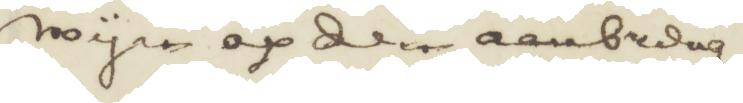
wijn op den aanbreng
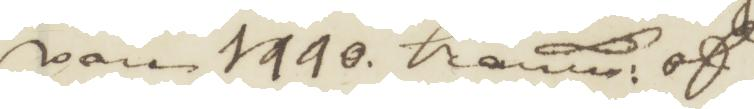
van 1440. kann: of
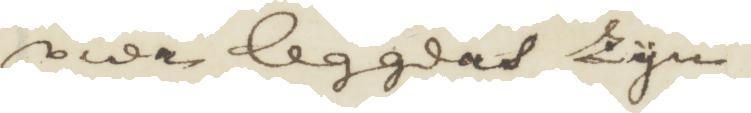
vier leggers zijn
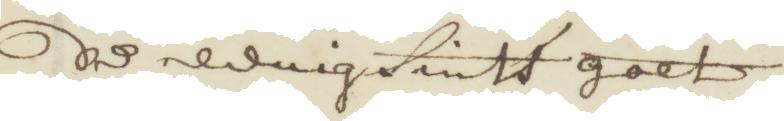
de eenigsints goet
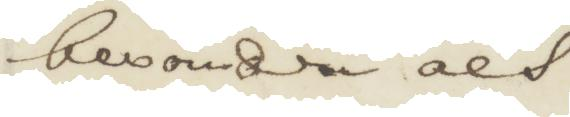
bevonden als
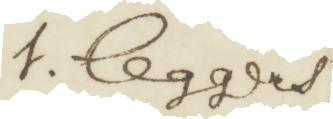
1. leggers
